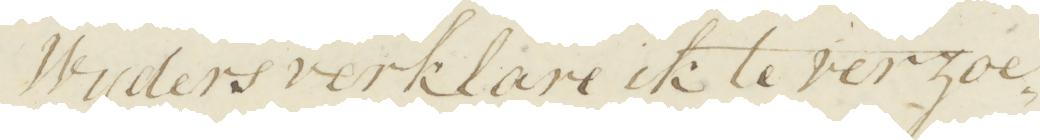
Wyders verklare ik te verzoe
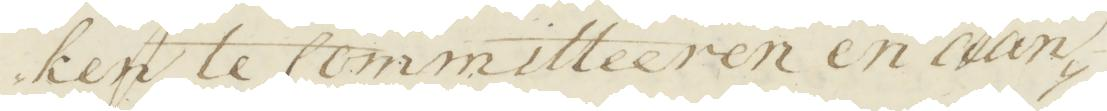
„ken, te committeeren en aan„
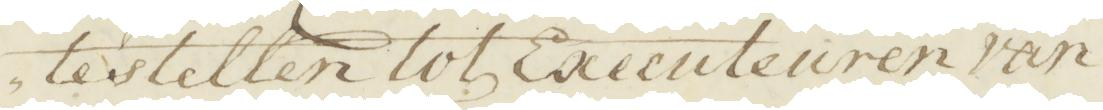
„te stellen tot Executeuren van
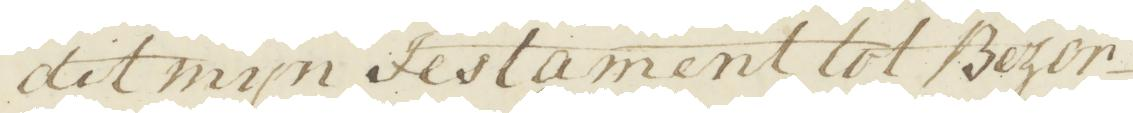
dit myn Testament tot Bezor
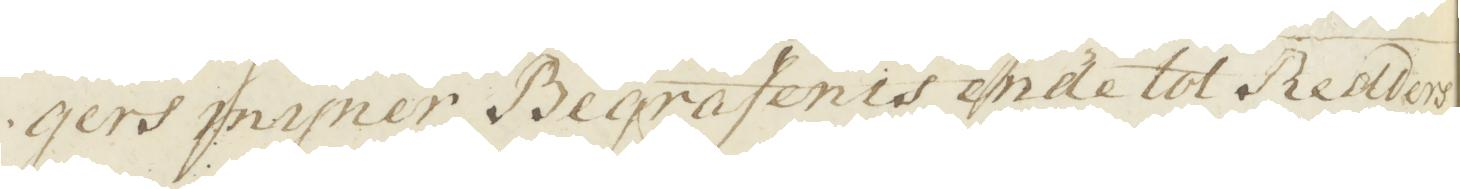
„gers myner Begrafenis, ende tot Redders
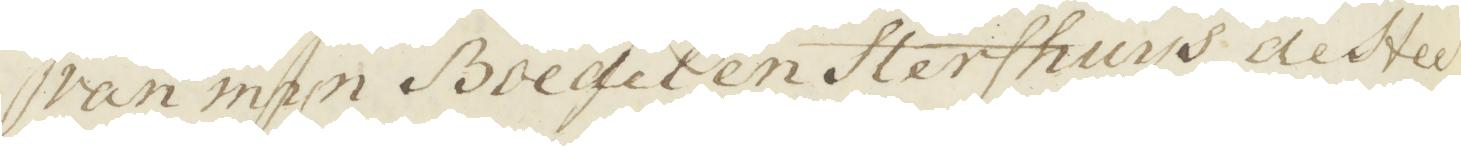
van myn Boedel en Sterfhuys, de Hee
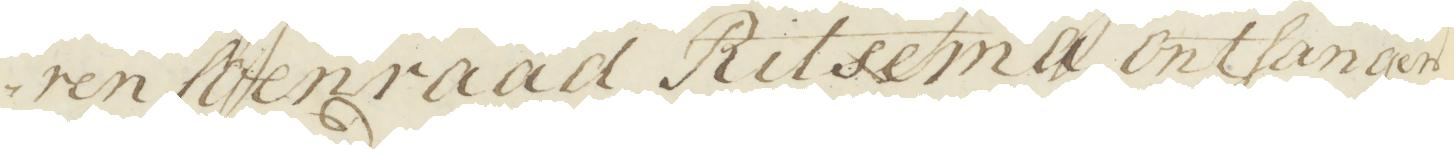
„ren Coenraad Ritsema, ontfanger
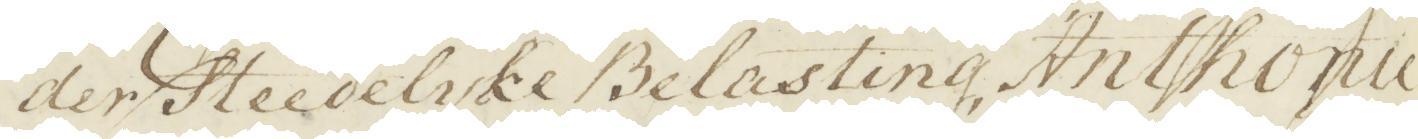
der Steedelyke Belasting, Anthonie
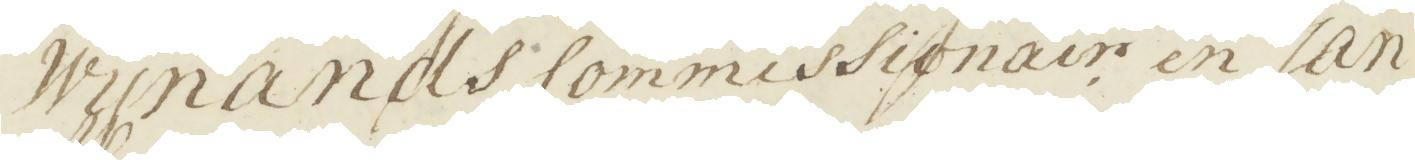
Wynands Commissionair, en Jan
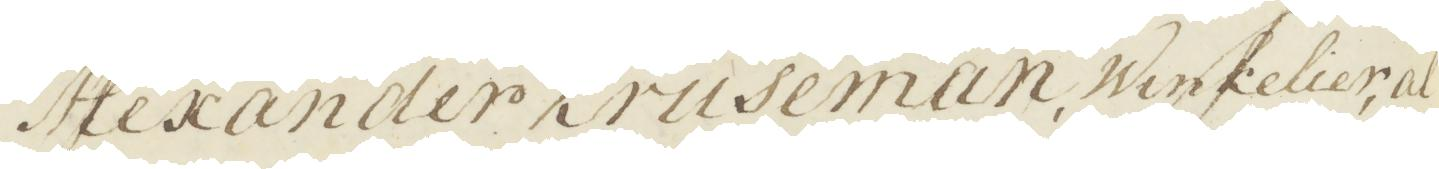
Alexander Kruseman, Winkelier, al
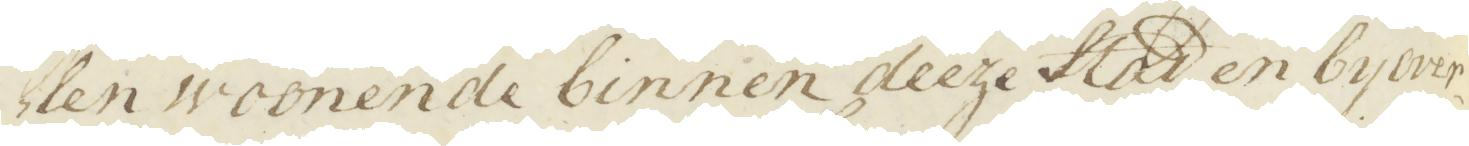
„len woonende binnen deeze Stad, en by over
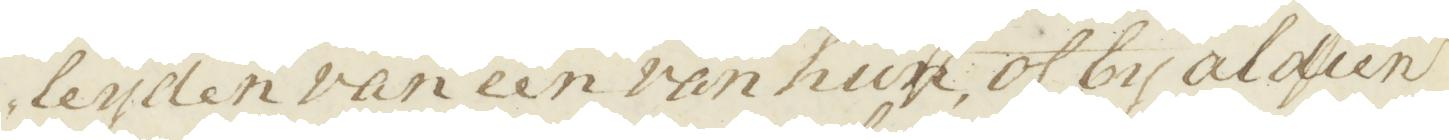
„leyden van een van hun, of by aldien
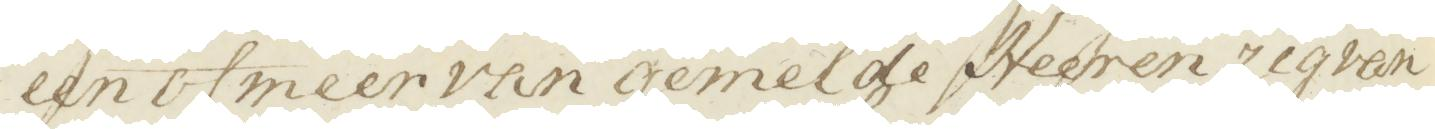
een of meer van gemelde Heeren zig van
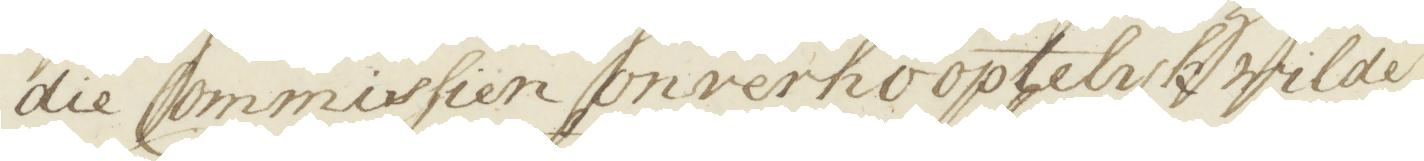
die Commissiën onverhooptelyk wilde
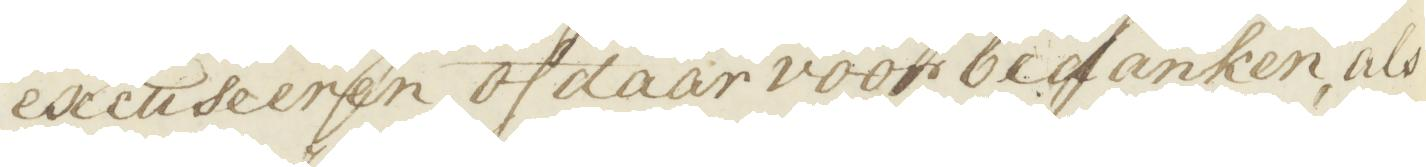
excuseeren, of daar voor bedanken, als
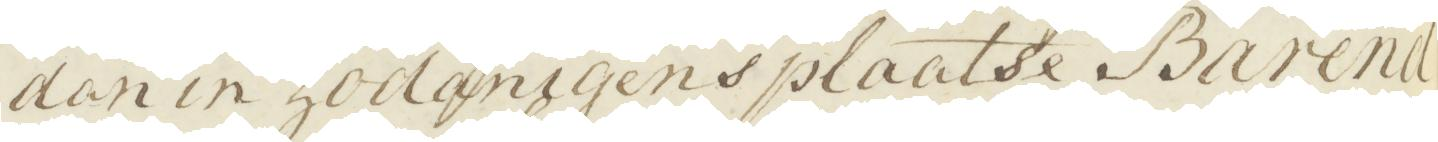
dan in zodanigens plaatse Barend
